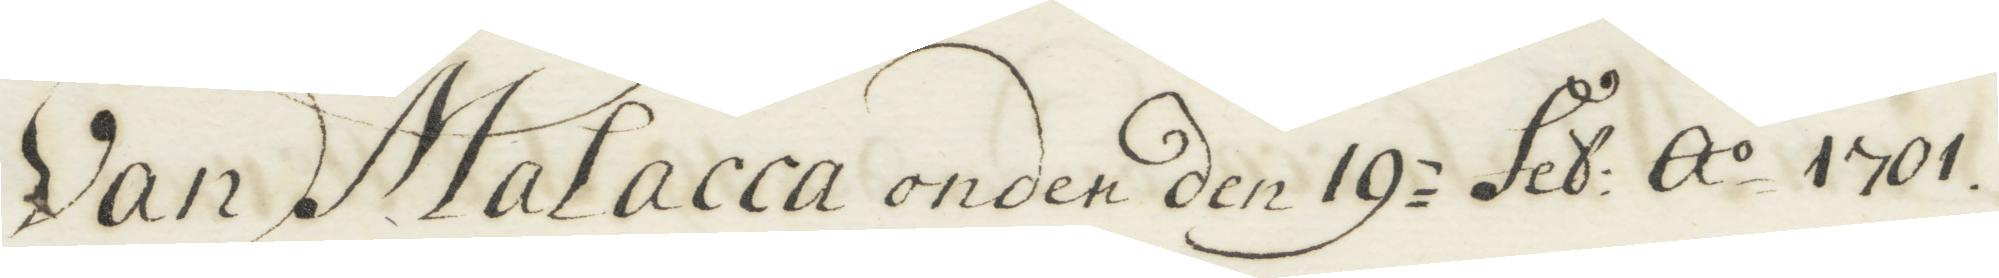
Van Malacca onder den 19=' Feb: A-o 1701.
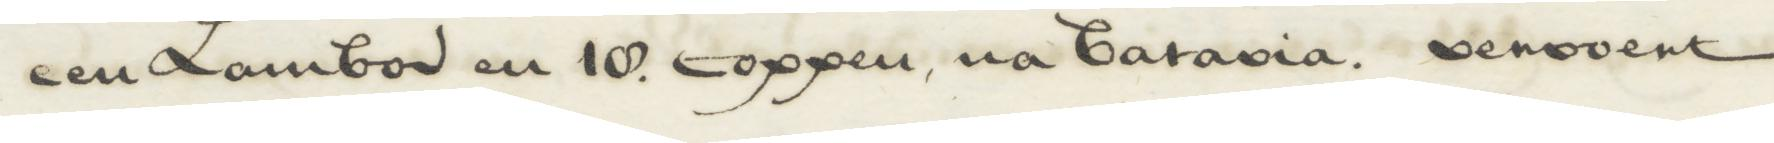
A=o 1700. een Lamboe en 18. coppen, na batavia. vervoert
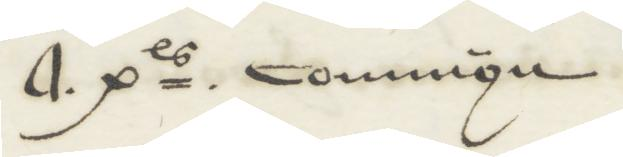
4. p=ls. commijn
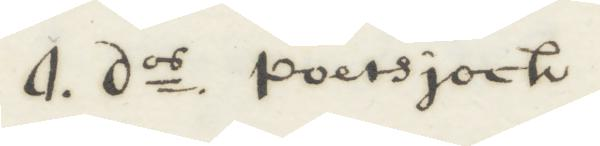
4. d=os. poetsjock
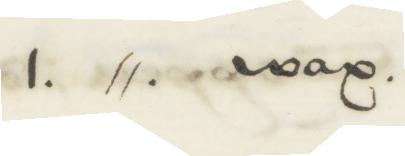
1. „. wax.
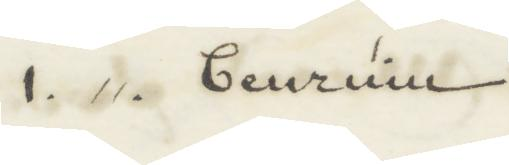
1. „. benzuin
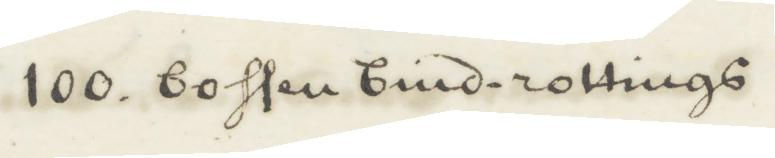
100. bossen bind-rottings
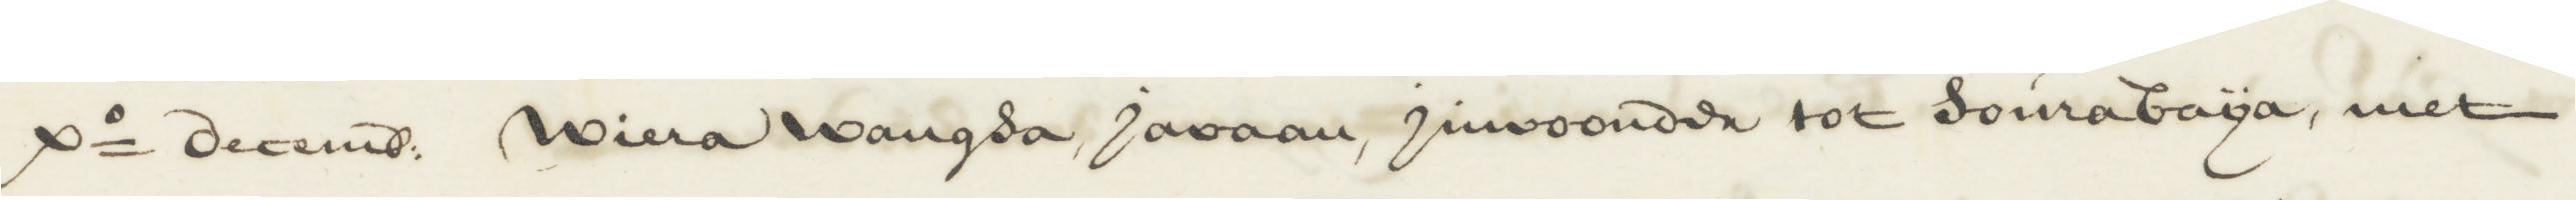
p=o decemb: wiera wangsa, javaan, jnwoonder tot sourabaija, met
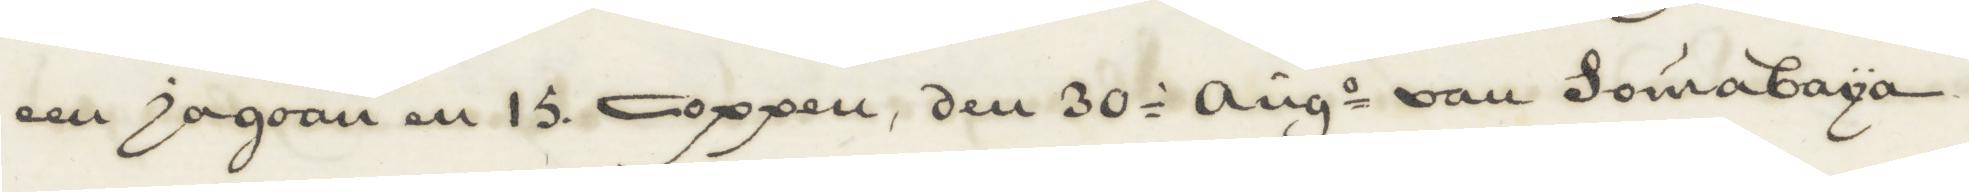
een jagoan en 15. coppen, den 30=' Aug=o van sourabaija
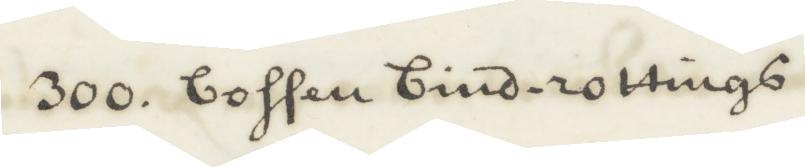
300. bossen bind-rottings
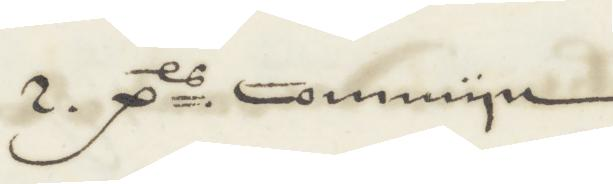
2. p=ls. commijn
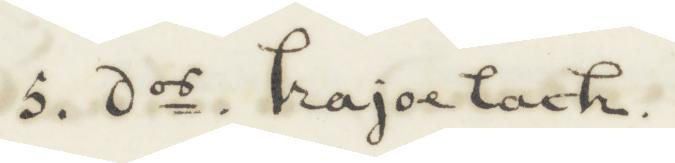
5. d=os. kajoelack.
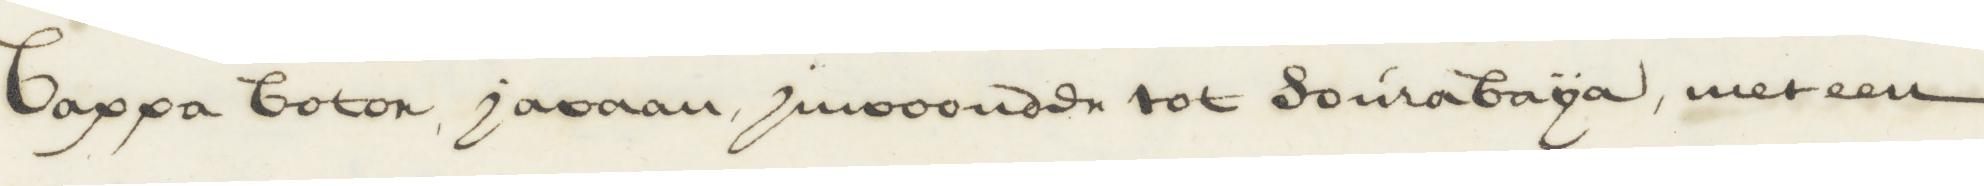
d=o. d=o. bappa botor, javaan, jnwoonder tot sourabaija, met een
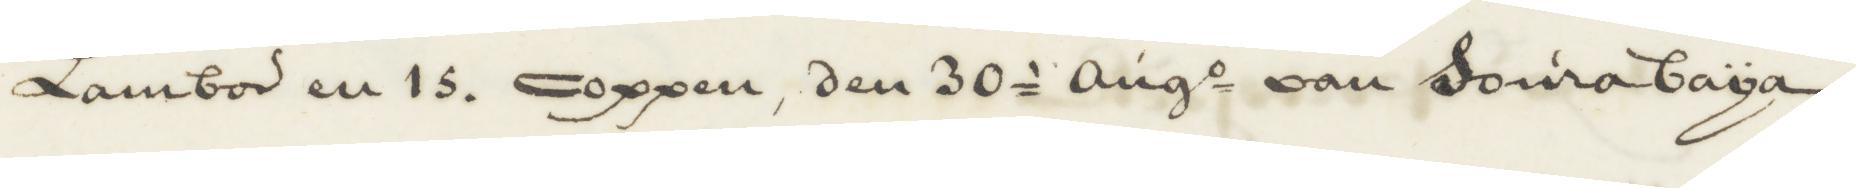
Lamboe en 15. coppen, den 30=' Aug=o van sourabaija
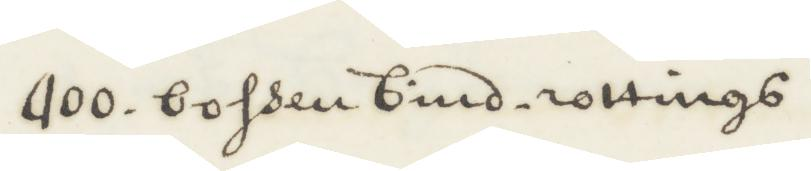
400. bossen bind-rottings
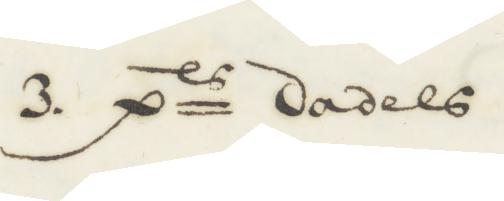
3. p=ls dadels
